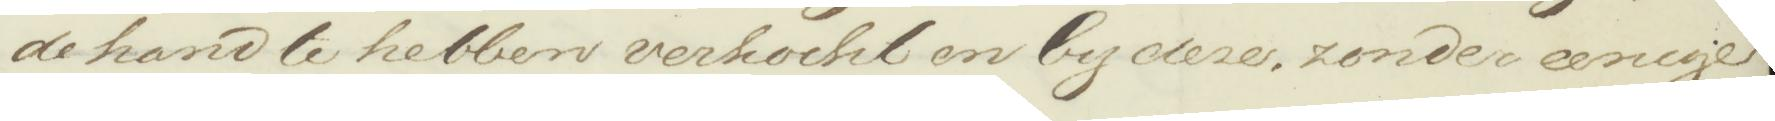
de hand te hebben verkocht en by deze, zonder eenige
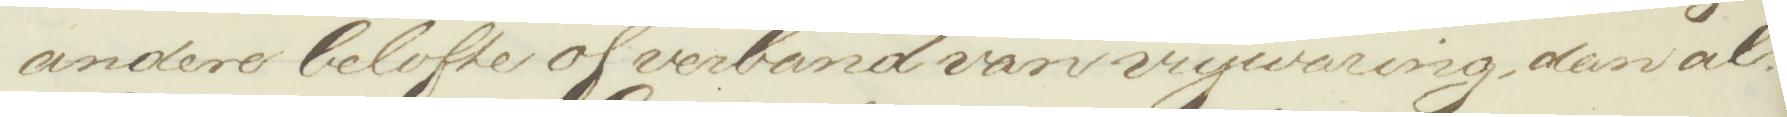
andere belofte of verband van vrywaring, dan al.
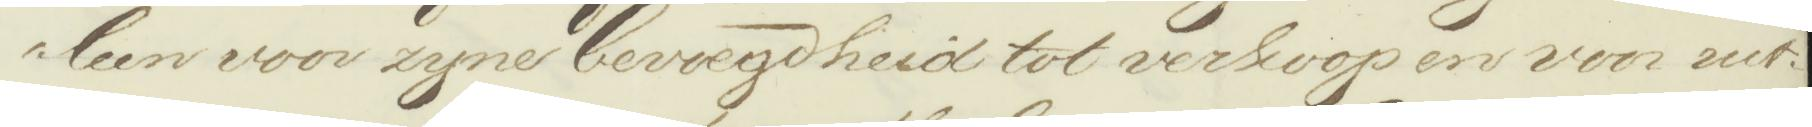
„leen voor zyne bevoegdheid tot verkoop en voor uit.
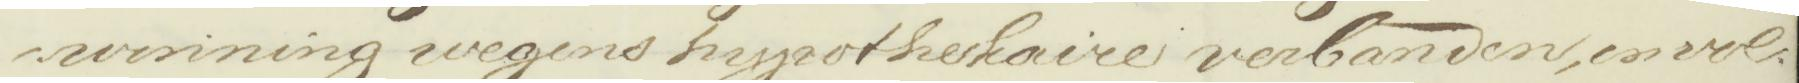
„winning wegens hypothekaire verbanden, in vol:
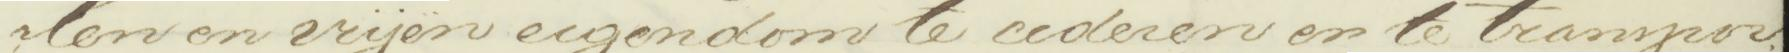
„len en vrijen eigendom te eideren en te transpor.
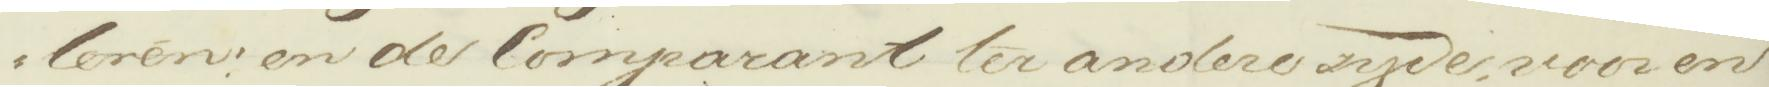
„teren; en de Comparant ter andere zyde, voor en
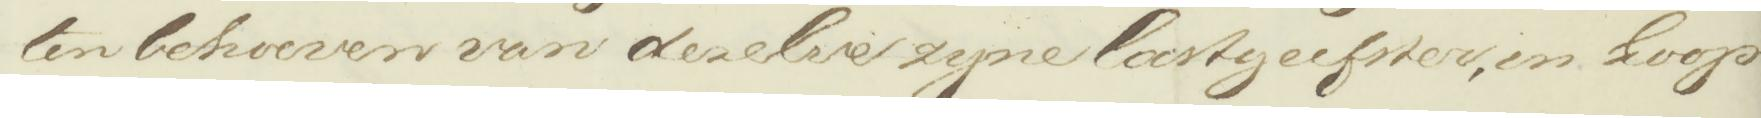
ten behoeven van dezelve zyne lastgeefster, in koop
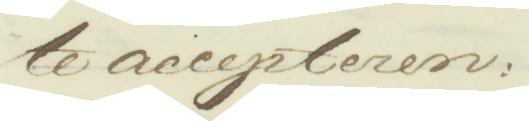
te accepteren:
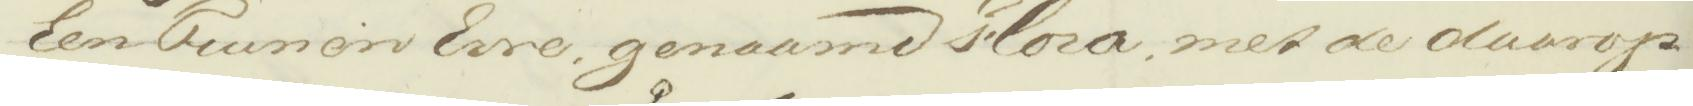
Een Tuin en Erve, genaamd Flora, met de daarop
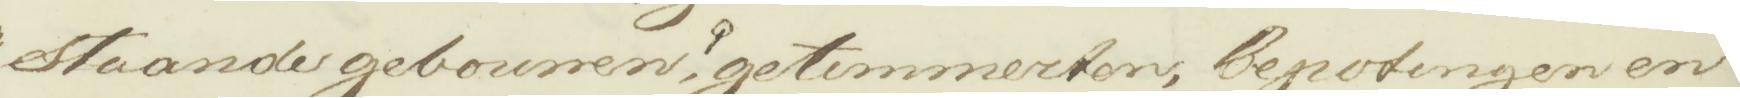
staande gebouwen, ¶ getimmerten, bepotingen en
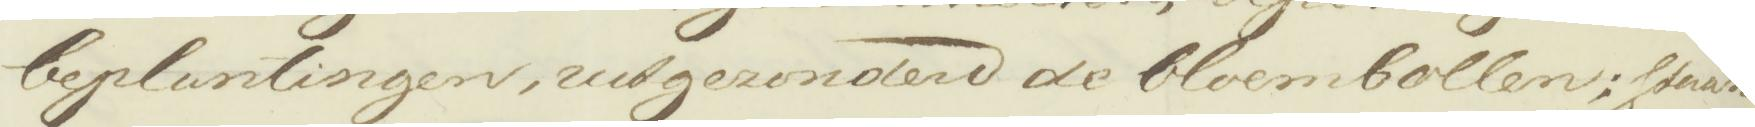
beplantingen, uitgezonderd de bloembollen; staan
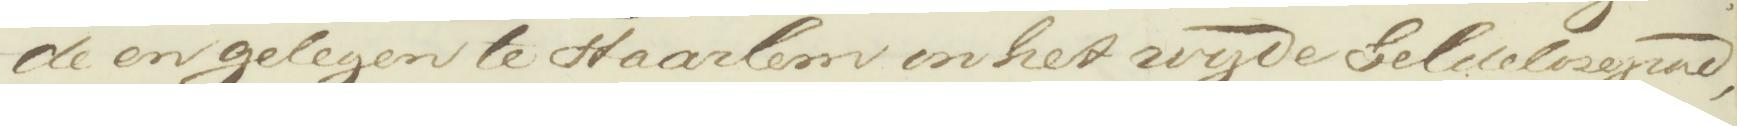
de en gelegen te Haarlem in het wyde Geldelozepad
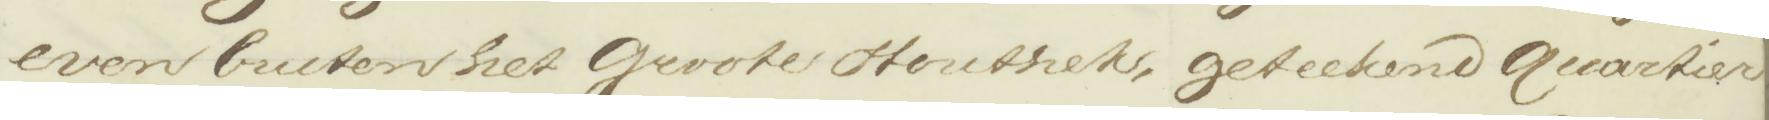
even buiten het groote Houthek, geteekend Quartier
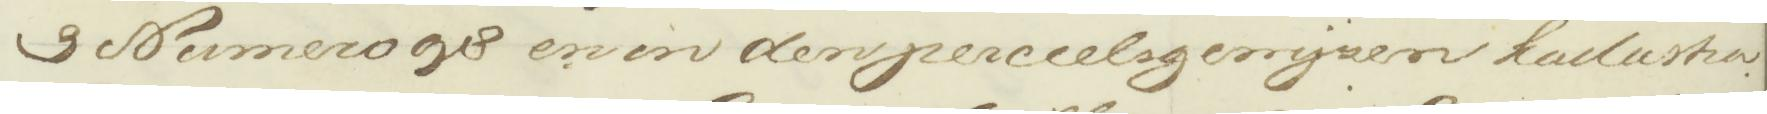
3 Numero 98 en in den perceels gewijzen kadastra.
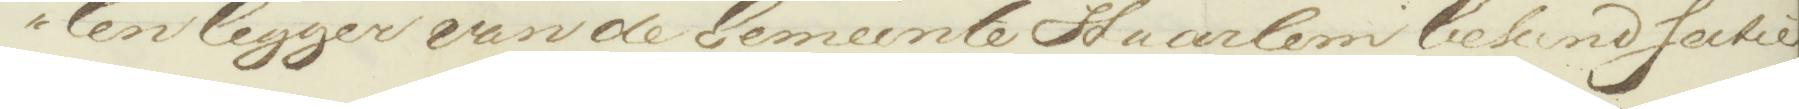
„len legger van de Gemeente Haarlem bekend Sectie
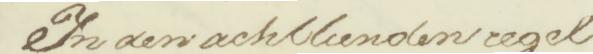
In den achttienden regel
